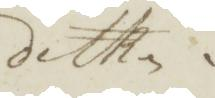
dikke
